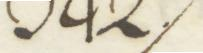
342./
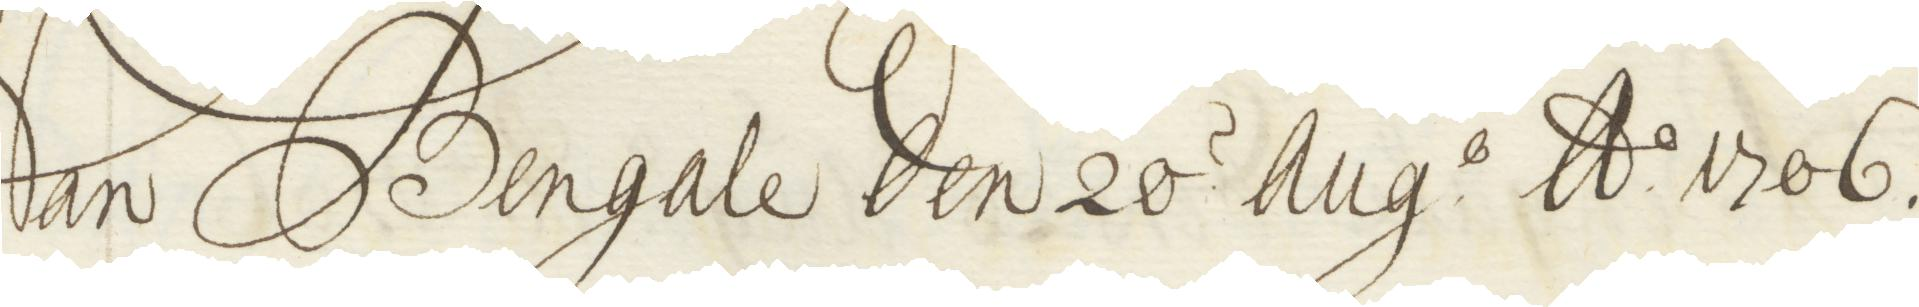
Van Bengale den 20.' Aug.o A.o 1706
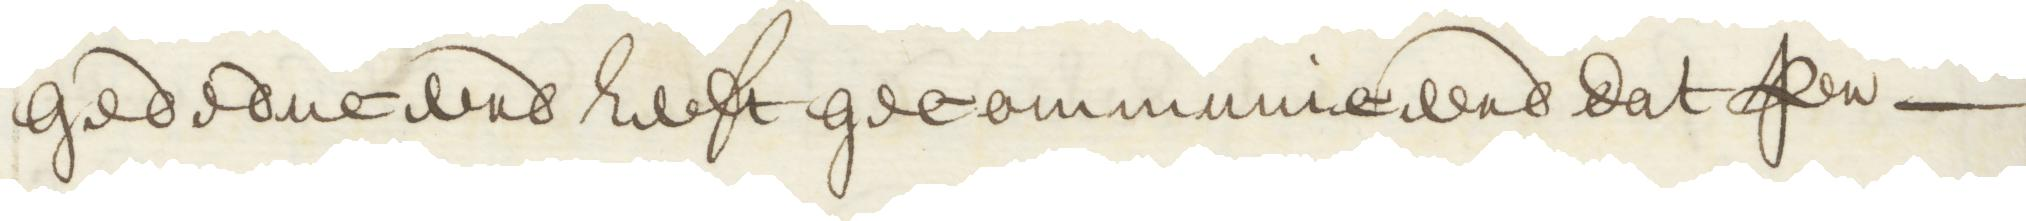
gededuceerd heeft gecommuniceerd dat per _
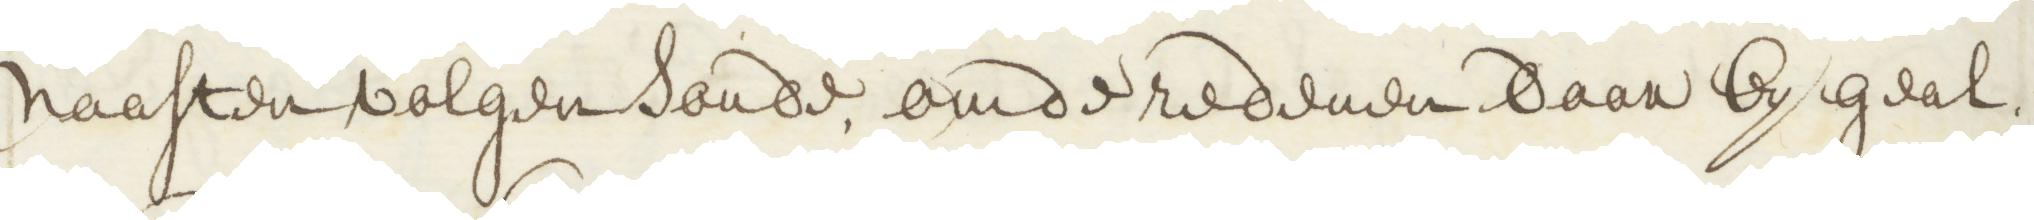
naasten volgen soude, om de redenen daar by geal,
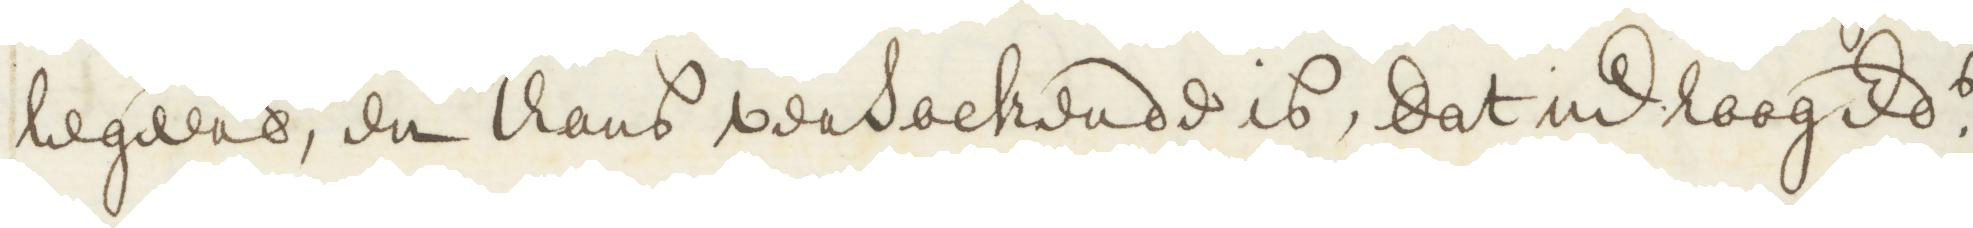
legeerd, en thans versoekende is, dat uE hoog Ed
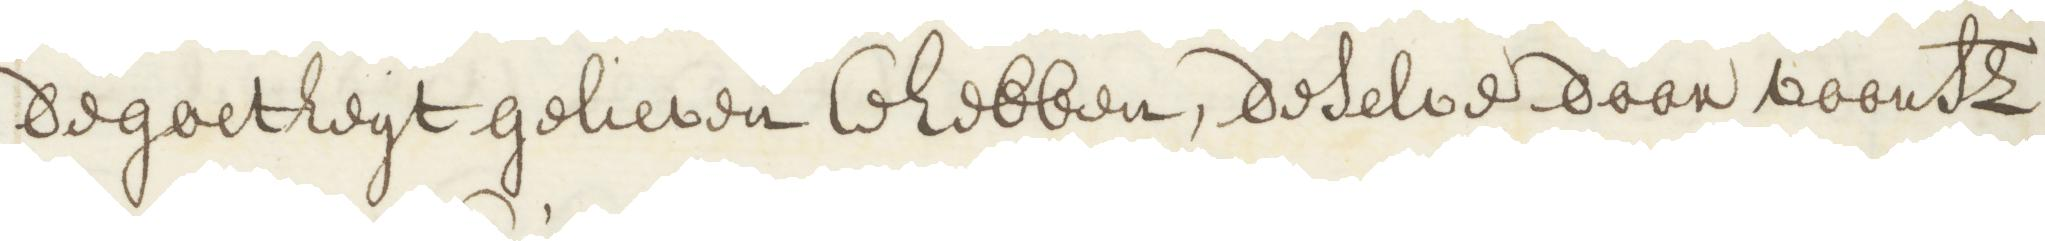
de goetheijt gelieven te hebben, deselve door voorsz
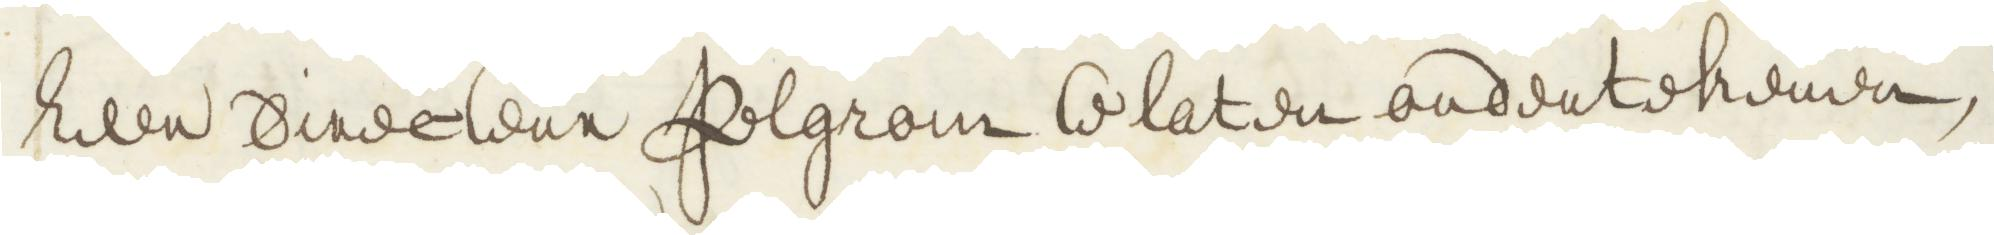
heer directeur Pelgrom te laten ondertekenen,
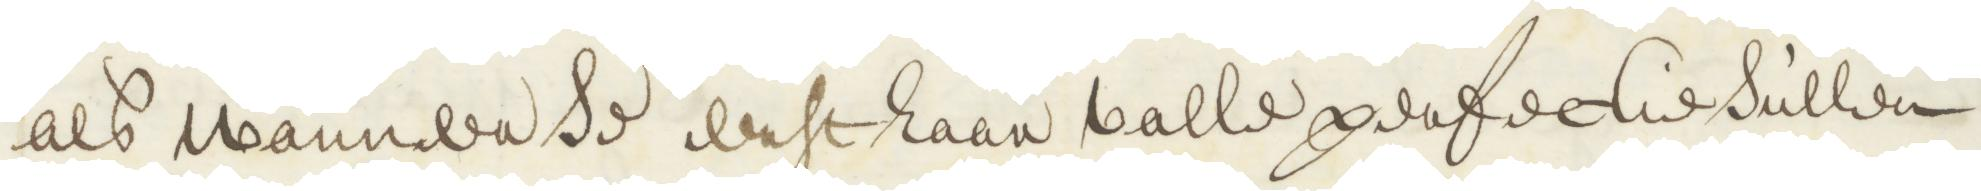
als wanneer se eerst haar valle perfectie sullen
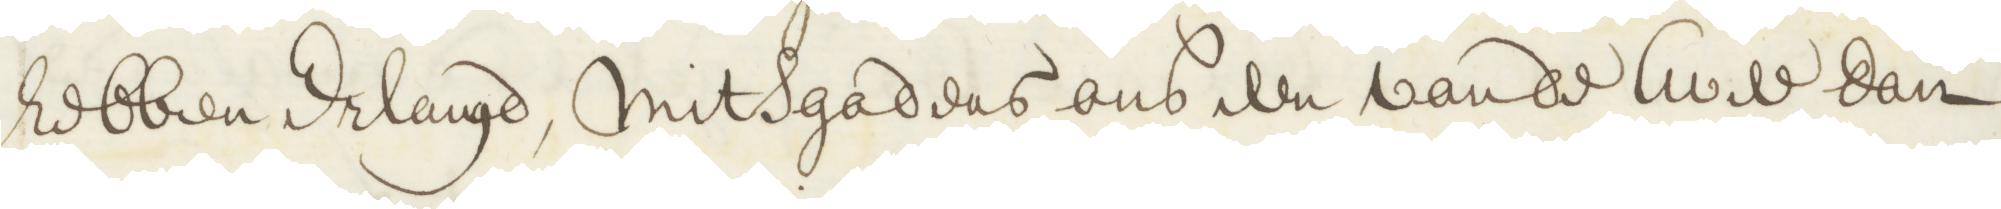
hebben Erlangd, mitsgaders ons een van de twee dan
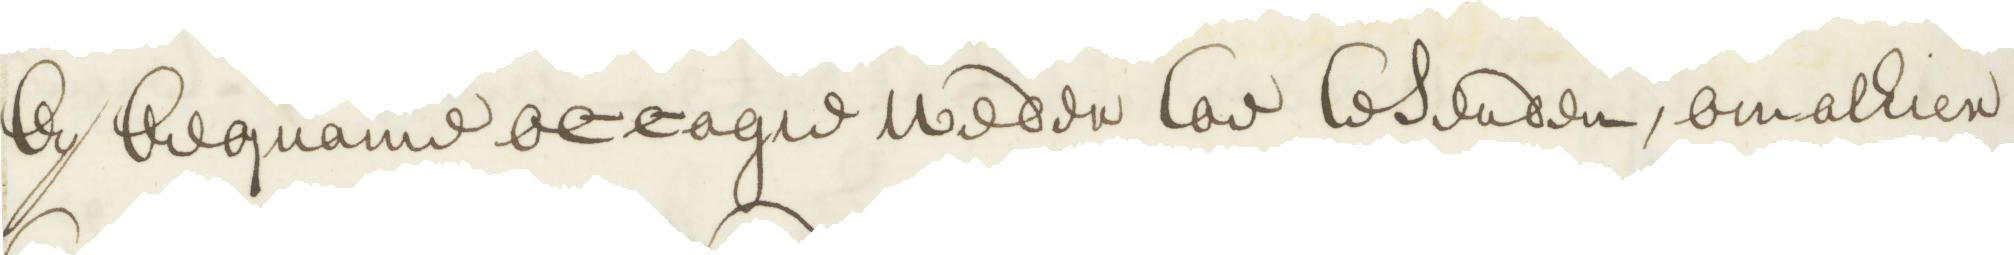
by bequame occagie weder toe te senden, om alhier
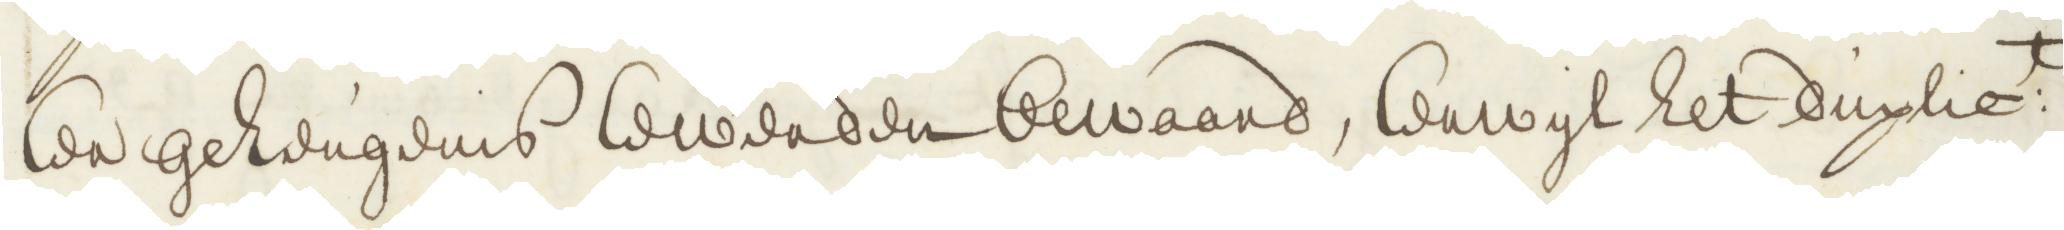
ter geheugenis te werden bewaard, terwijl het duplic:t
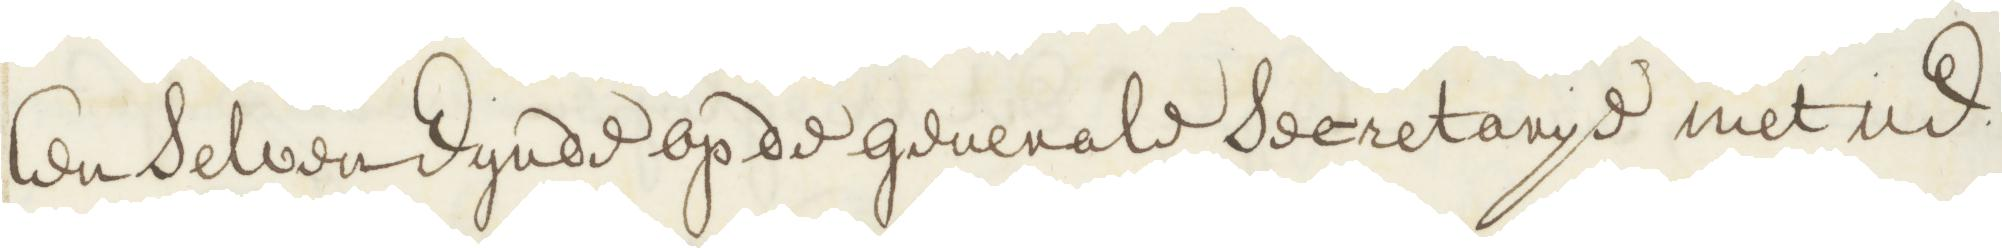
ten selven Eijnde op de generale secretarije met uE
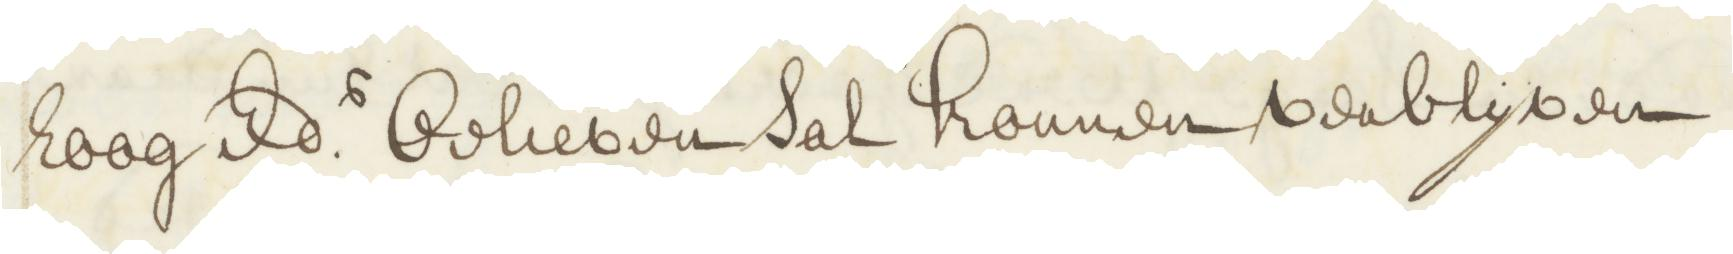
hoog Ed.s believen sal konnen verblijven
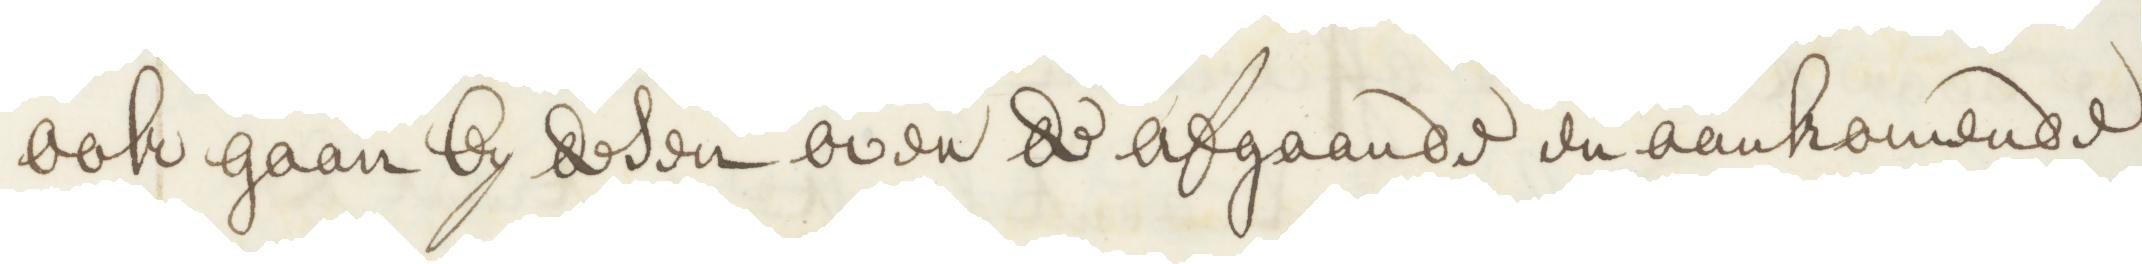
ook gaan by desen over de afgaande en aankomende
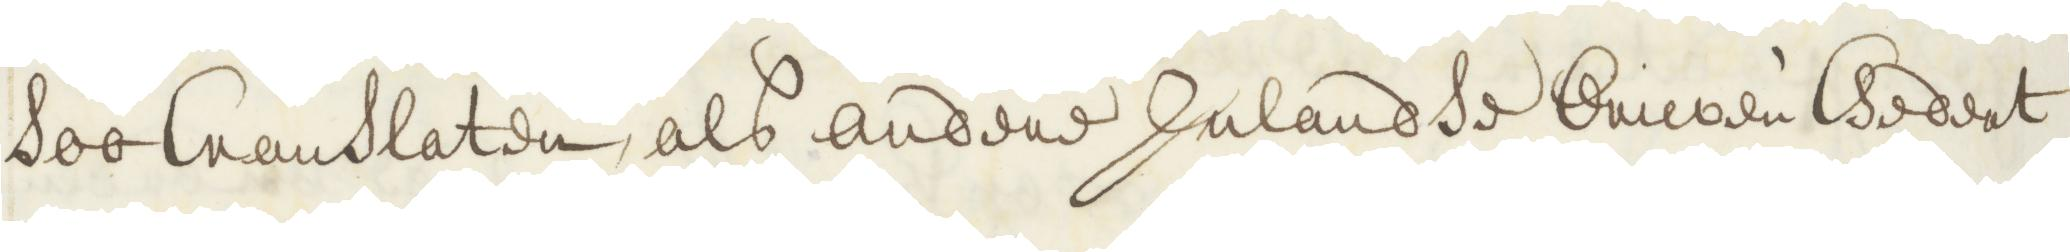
soo translaten, als andere Jnlandse brieven 'tsedert
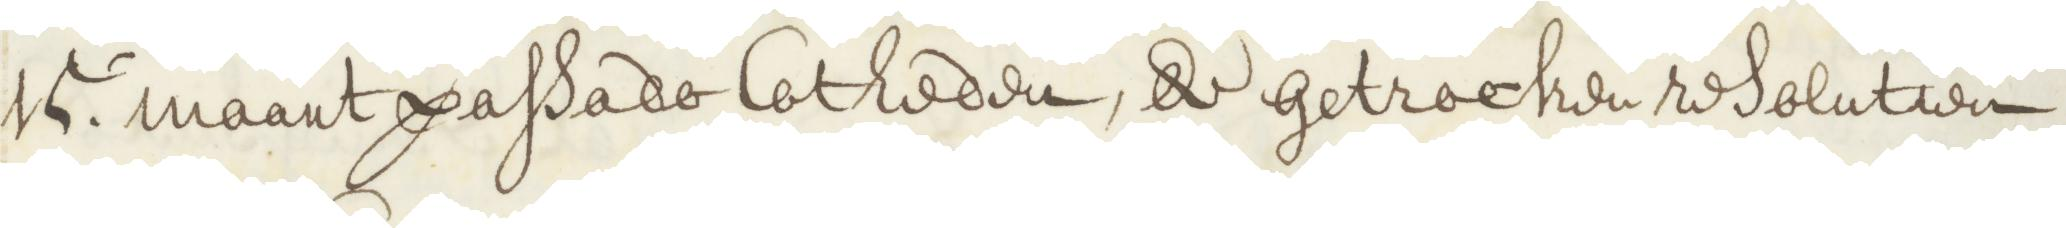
15.' maart passado tot heden, de getrocken resolutien
